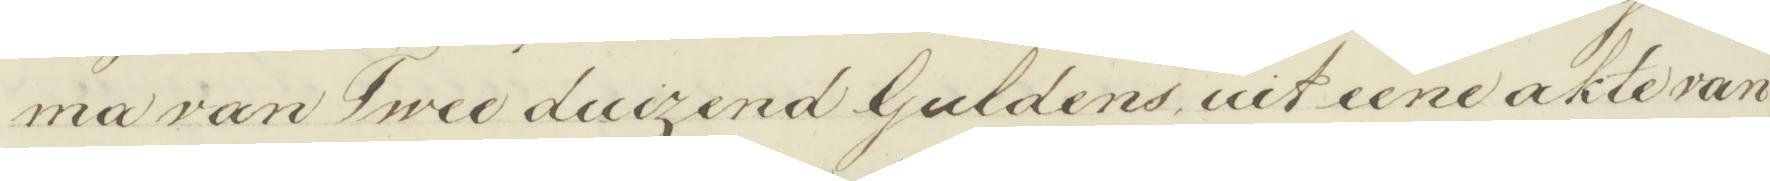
ma van Twee duizend Guldens, uit eene akte van
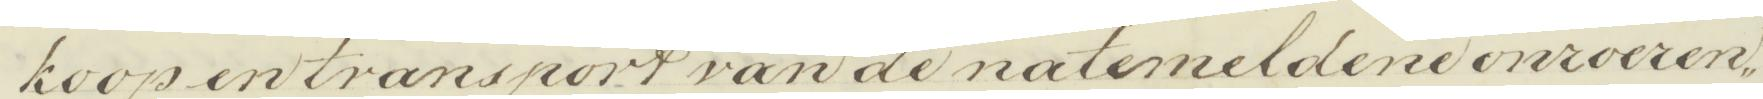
koop en transport van de natemeldene onroeren„
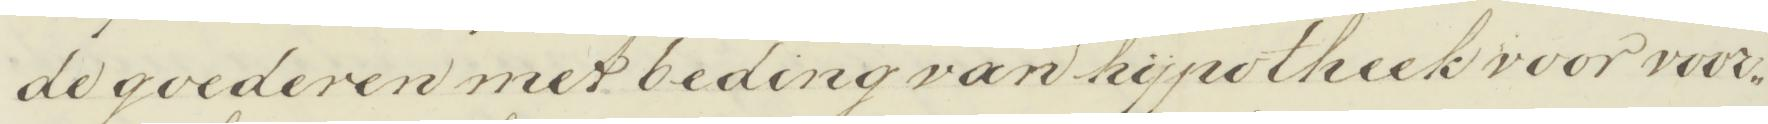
de goederen met beding van hijpotheek voor voor„
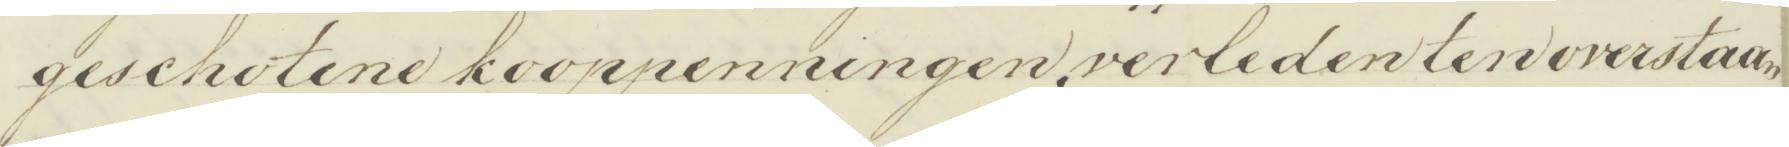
geschotene kooppenningen, verleden ten overstaan
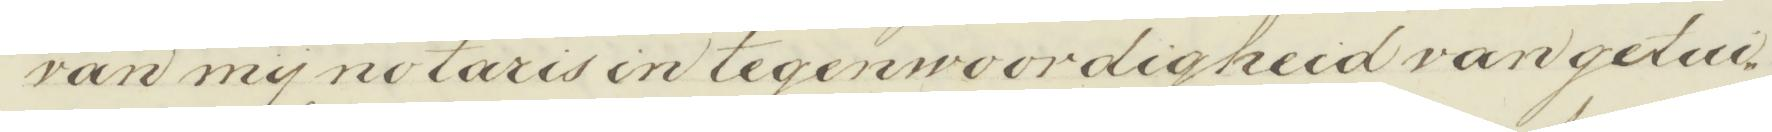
van mij notaris in tegenwoordigheid van getui„
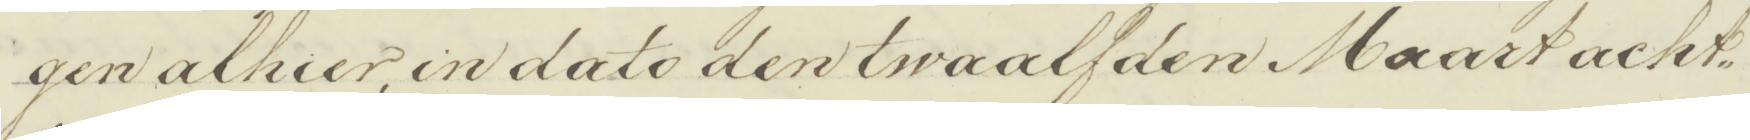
gen alhier, in dato den twaalfden Maart acht„
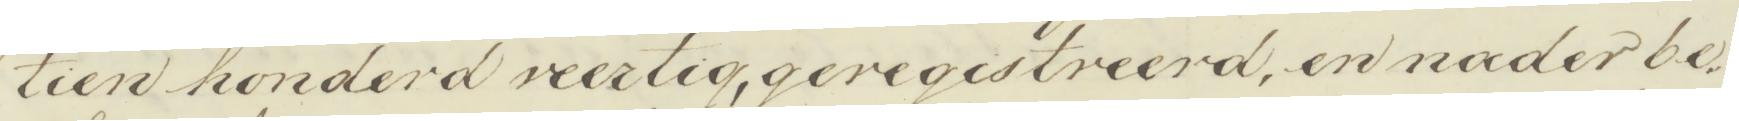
tien honderd veertig, geregistreerd, en nader be„
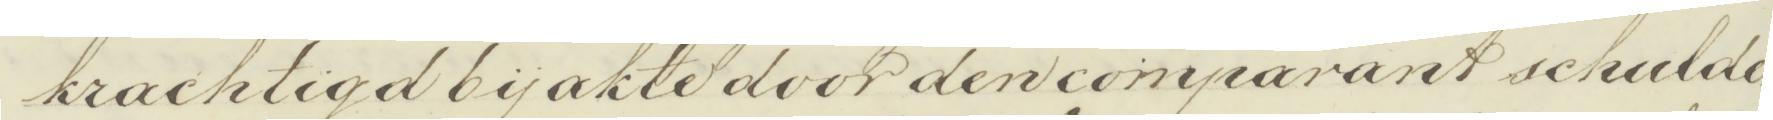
krachtigd bij akte door den comparant schulde
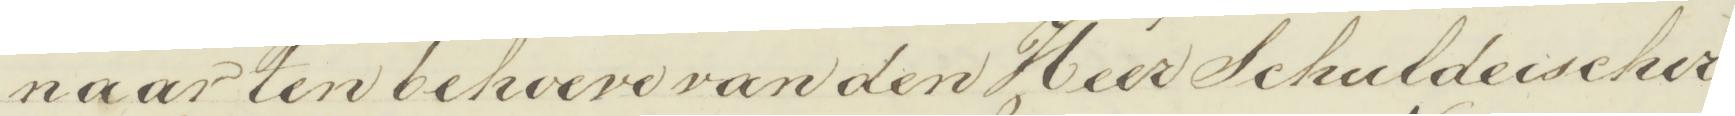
naar ten behoeve van den Heer Schuldeischer
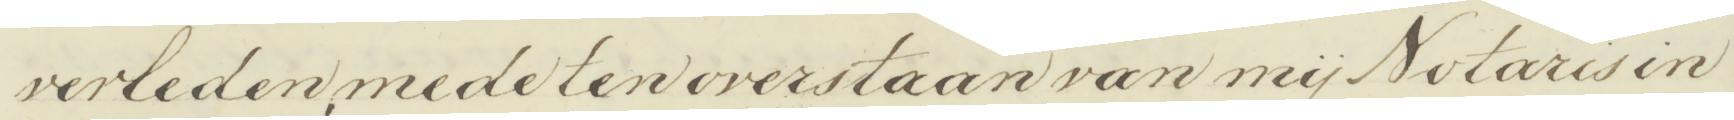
verleden mede ten overstaan van mij Notaris in
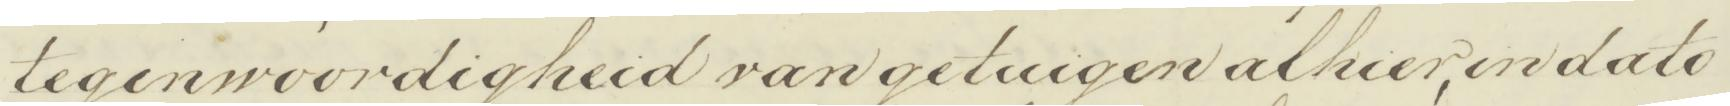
tegenwoordigheid van getuigen alhier, in dato
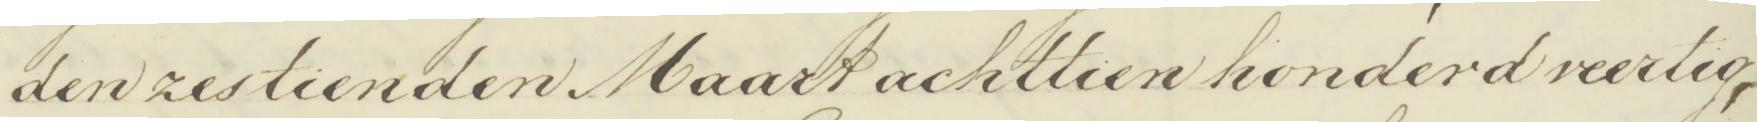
den zestienden Maart achttien honderd veertig,
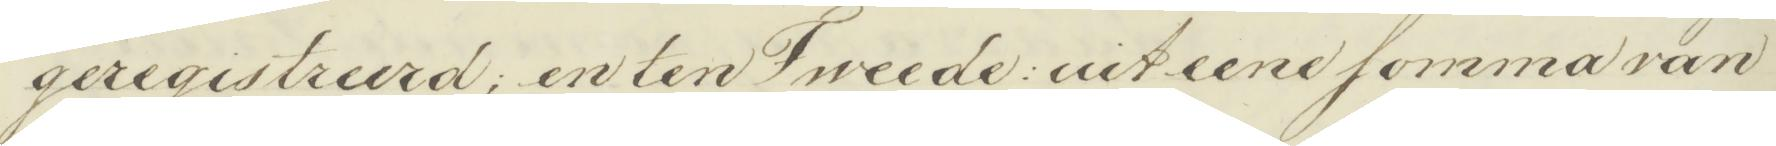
geregistreerd; en ten Tweede: uit eene somma van
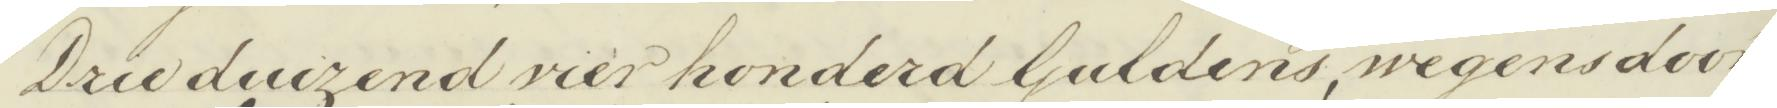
Drie duizend vier honderd Guldens, wegens door
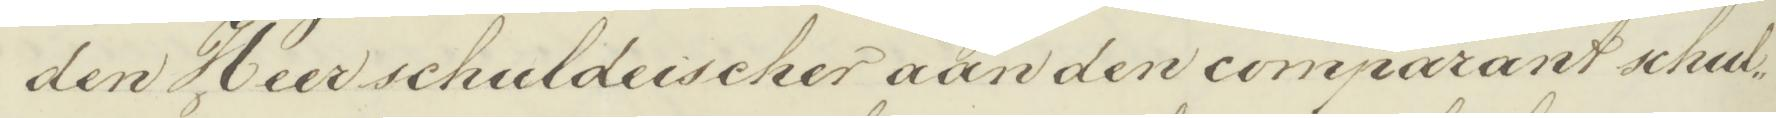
den Heer schuldeischer aan den comparant schul„
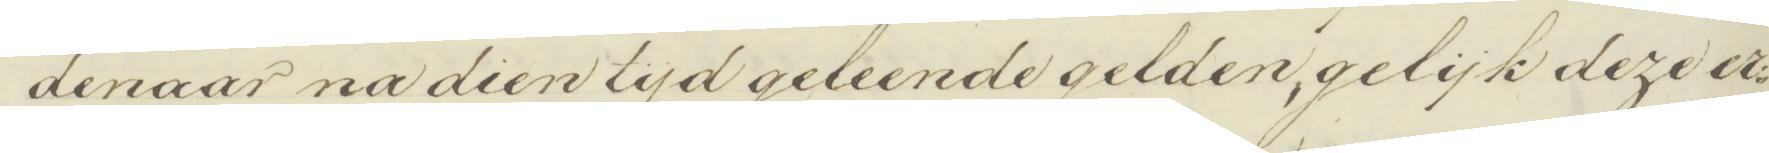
denaar na dien tijd geleende gelden, gelijk deze er„
